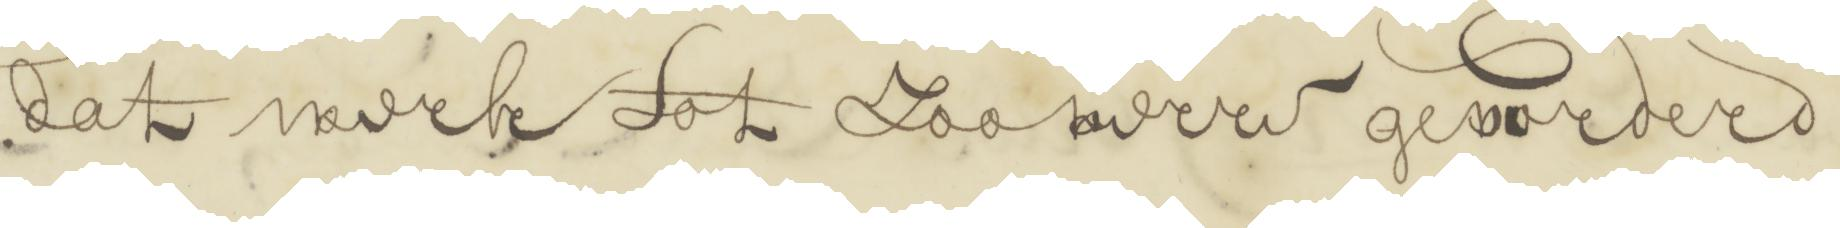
dat werk tot zooverre gevorderd
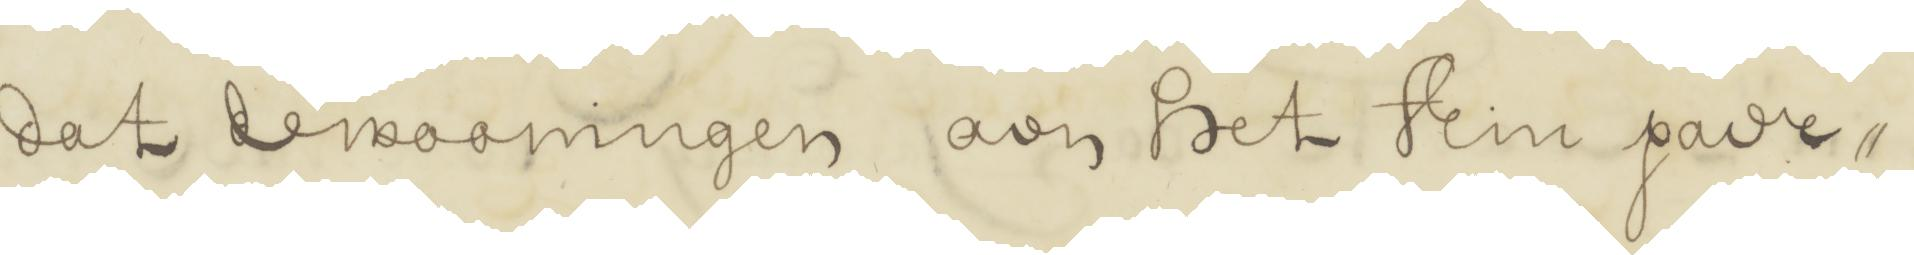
dat de wooningen aen het thin paer„
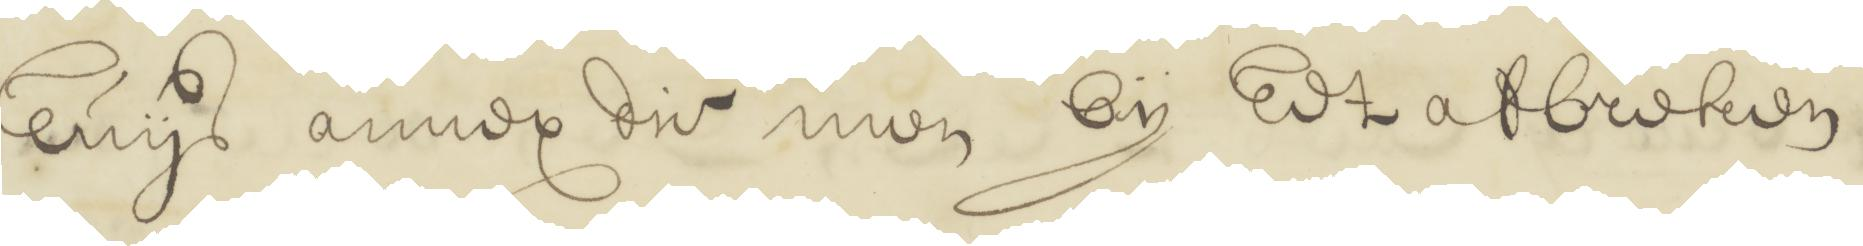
huijs annex die men bij het afbreken
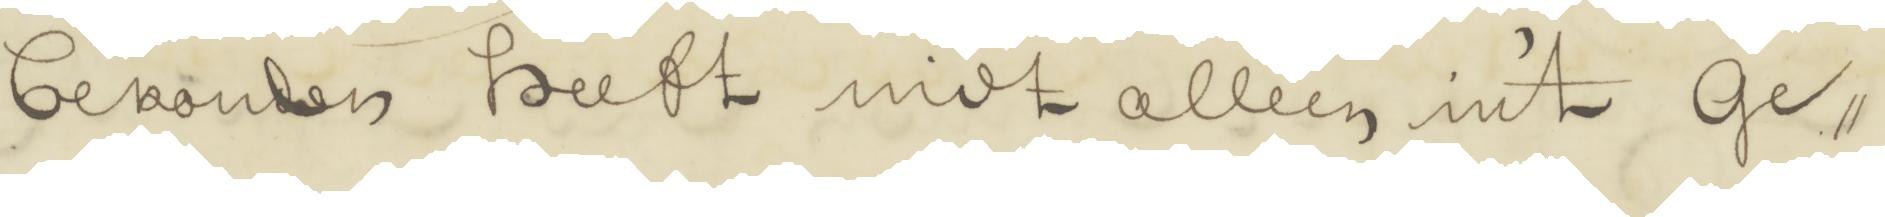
bevonden heeft niet alleen in’t Ge„
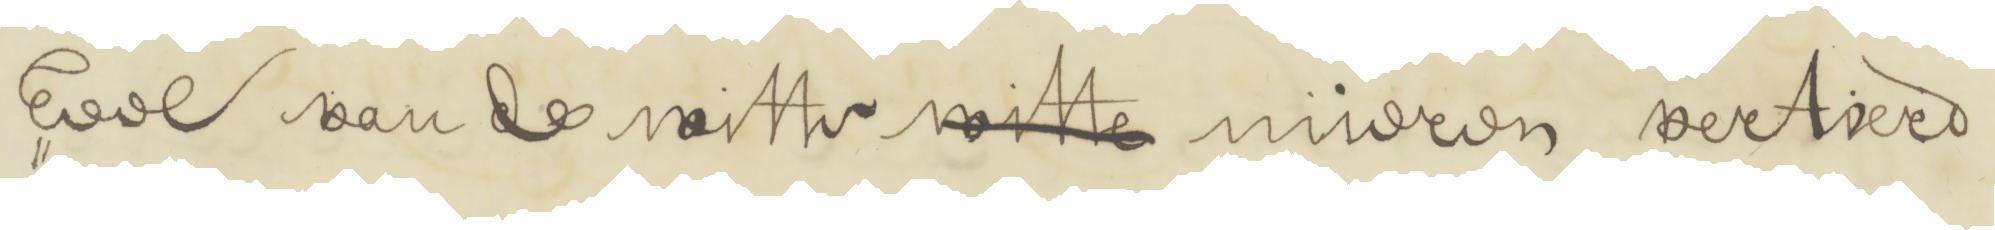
heel van de witte witte mieren vertierd
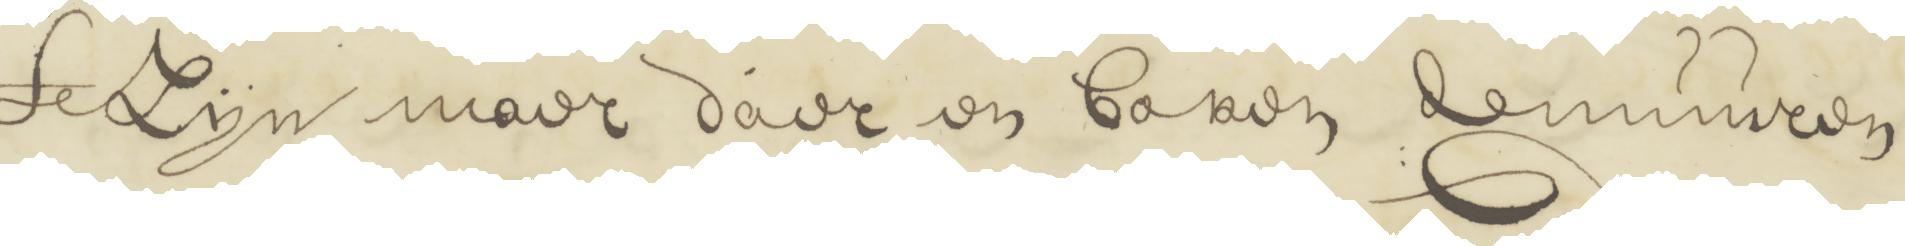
te zijn maer daer en boven de muuren
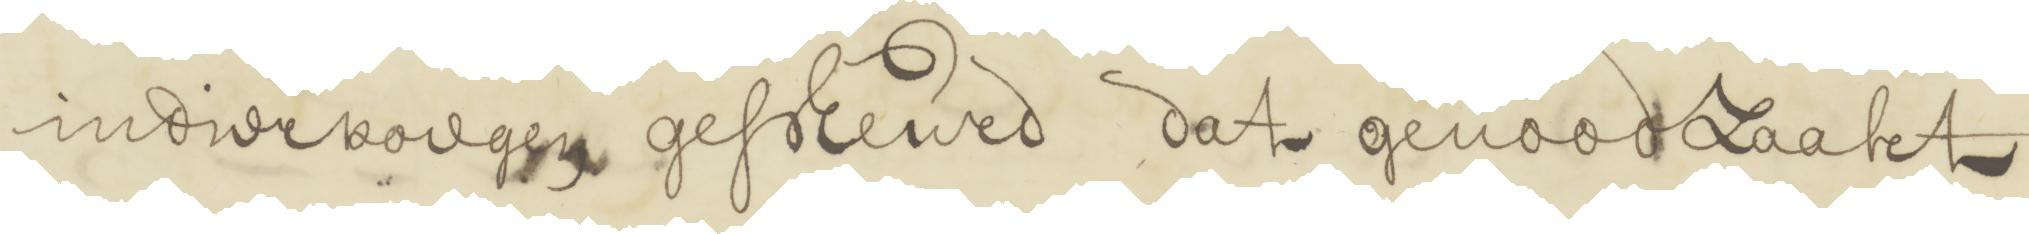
indiervoegen gescheurd dat genoodzaakt
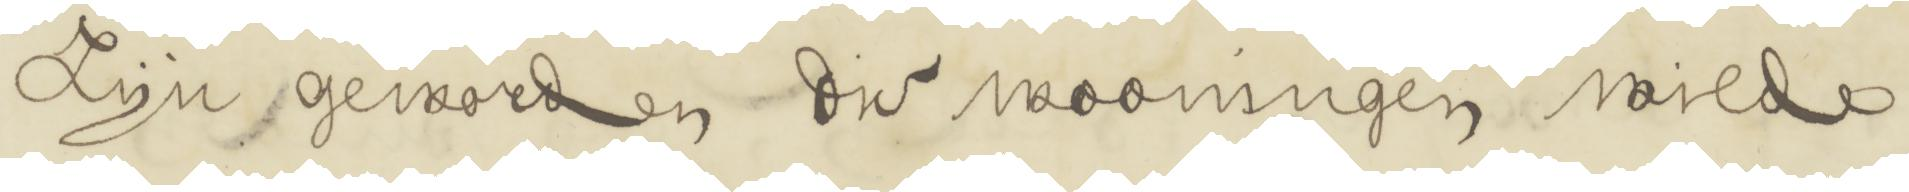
zijn geworden die wooningen wilde
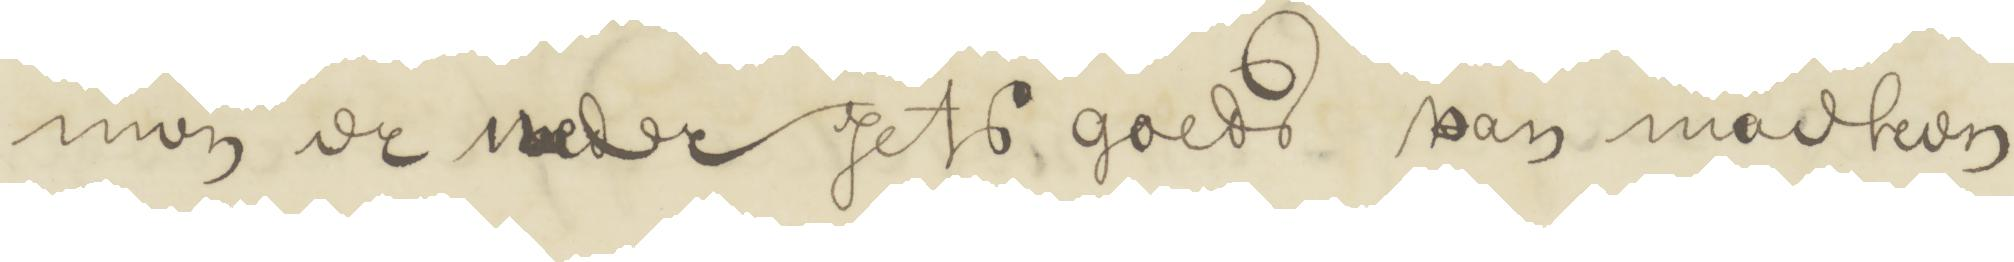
men er weder jets goeds van maeken
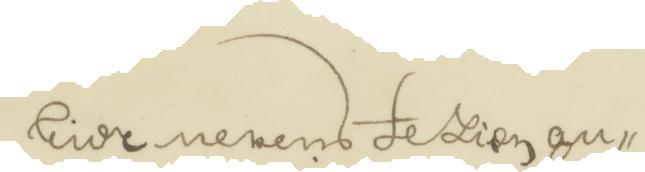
hier nevens tezien an„
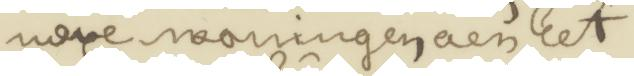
nexe woningen aen het
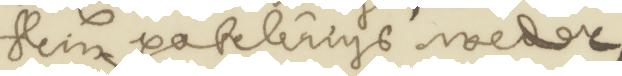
stein pakhuijs weder
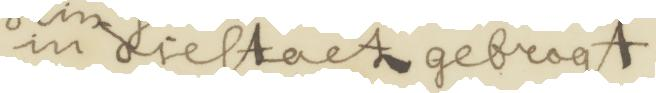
in diestaet gebrogt
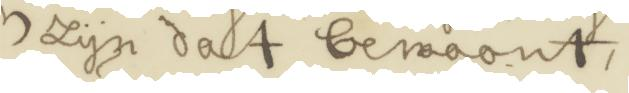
zijn dat bewoont,
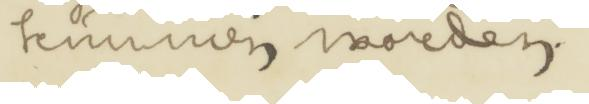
kunnen worden.
